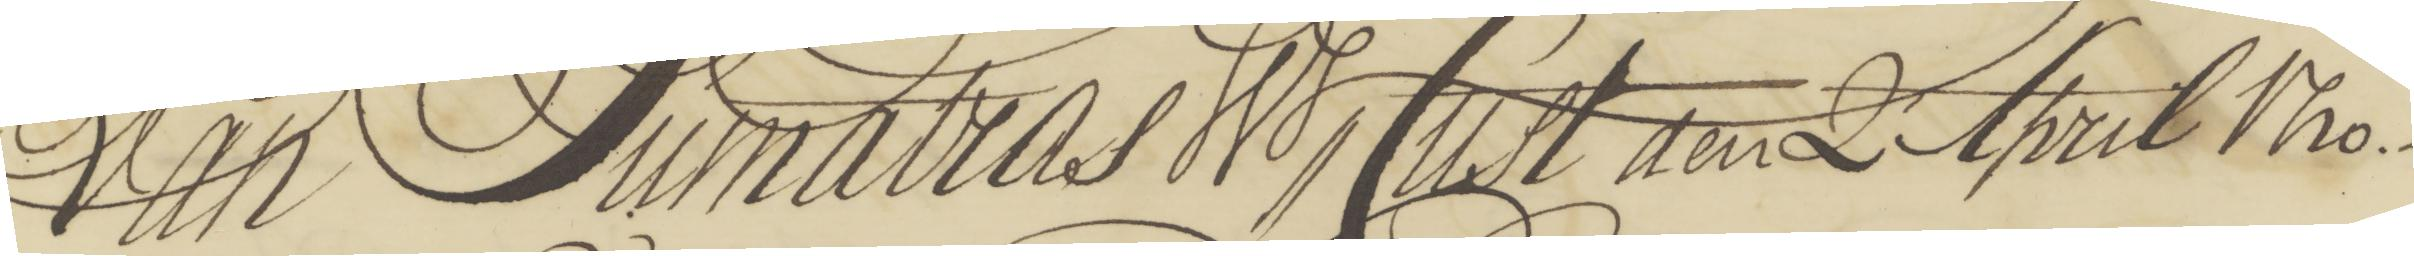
Van Sumatras W„s Cust den 2' April 1710.
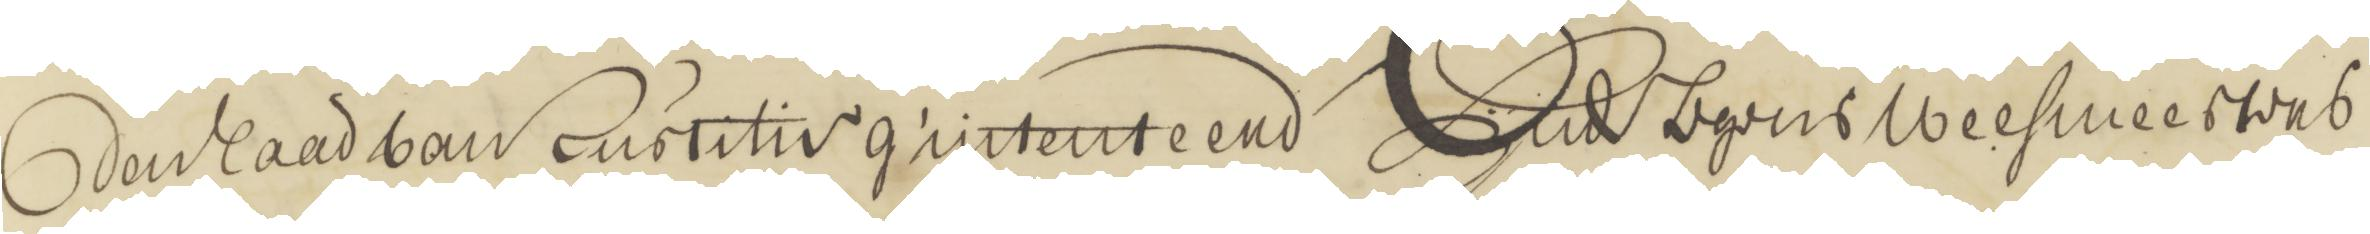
den raad van Justitie g'intenteerd sijnde tegens weesmeesters
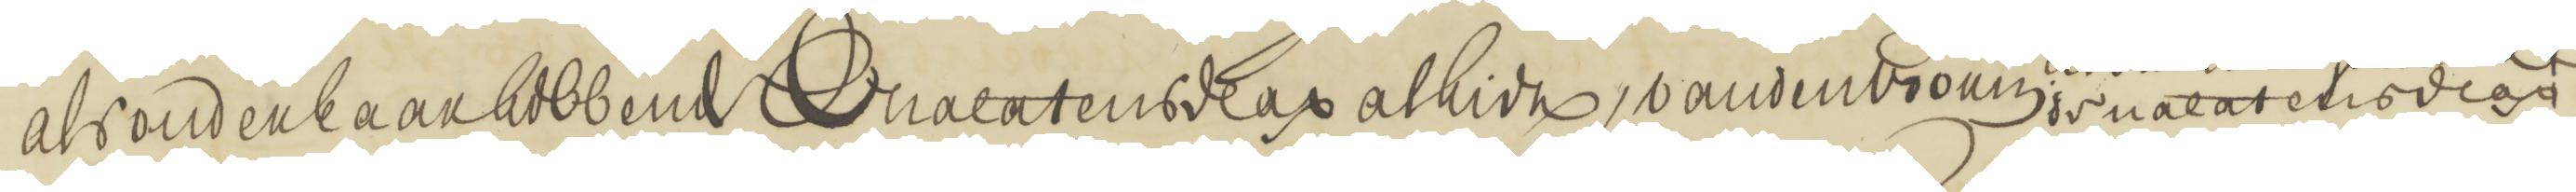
als onder haar hebbende de nalatenschap alhier, van den voorm: de nalatenschap
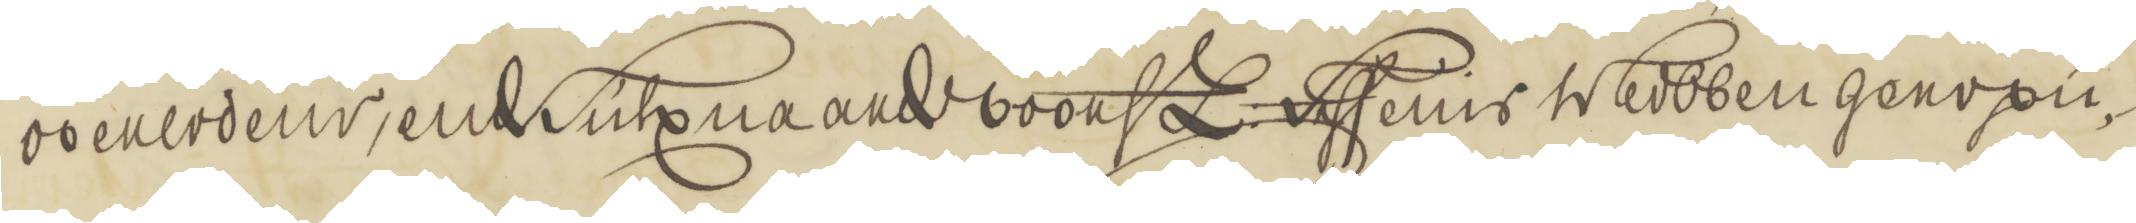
overledene, ende sulx naar de voorsz: Erffenis te hebben gerepu‚
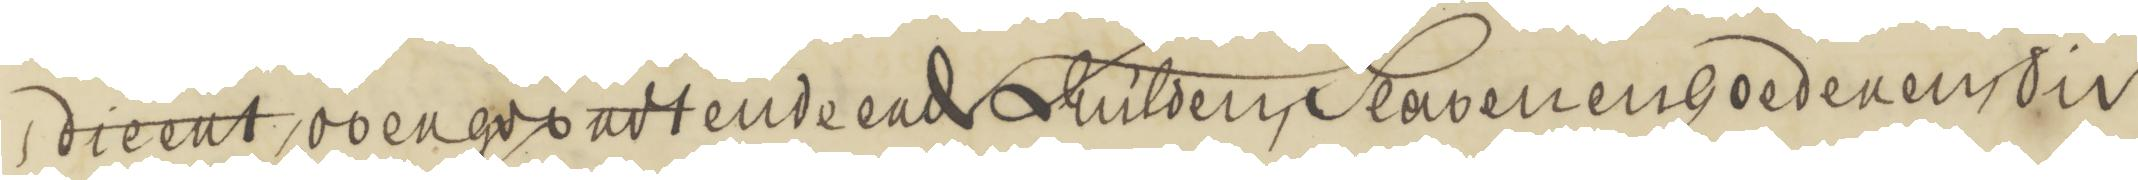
‚dieert, over gepretendeerd schulden, Slaven en goederen, die
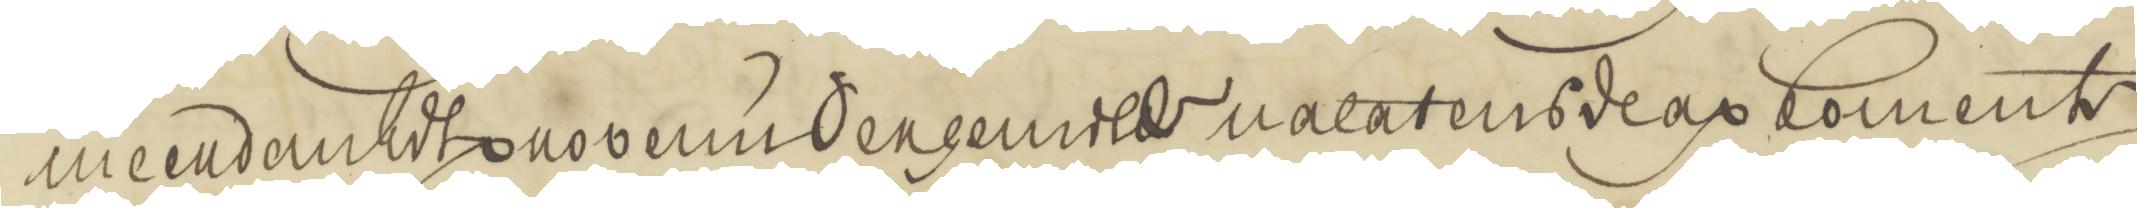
meer dan het provenu der gemelde nalatensschap komen te
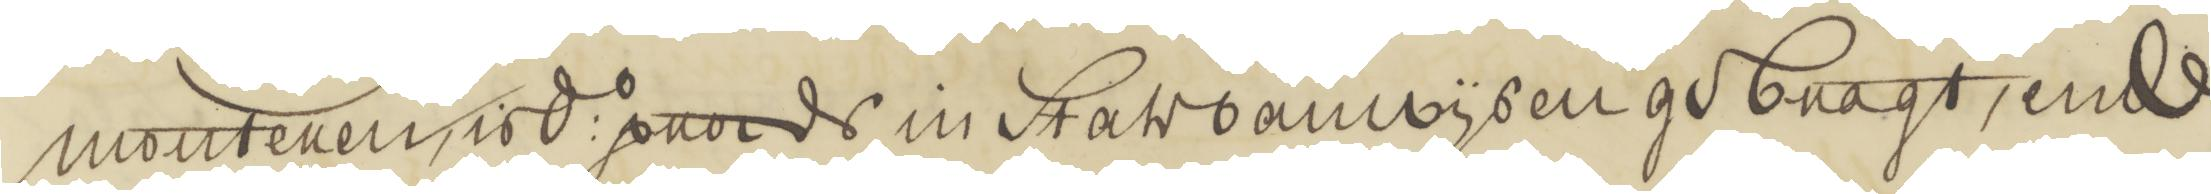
monteren, is d:o proces in State van wijsen gebragt, ende
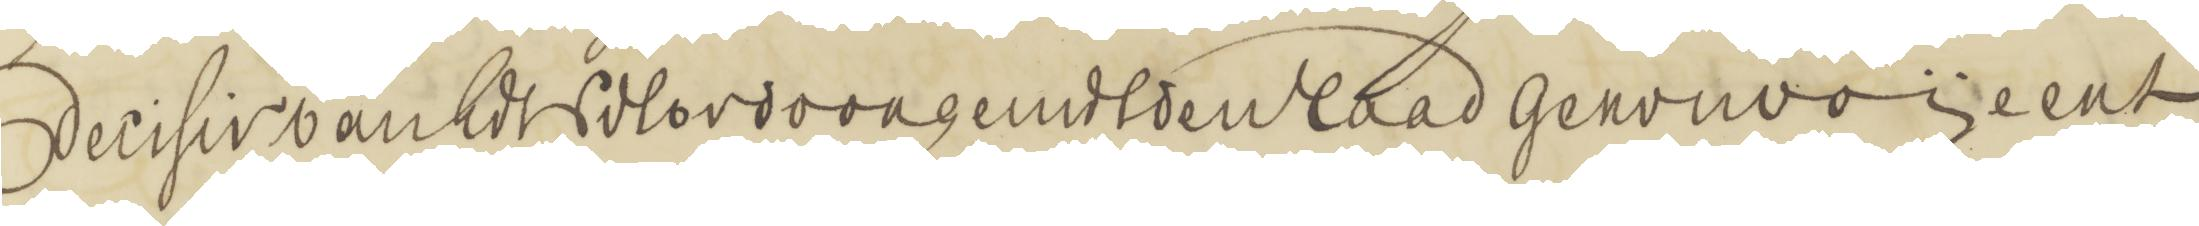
decisie van het selve door gemelden raad gerenvoijeert
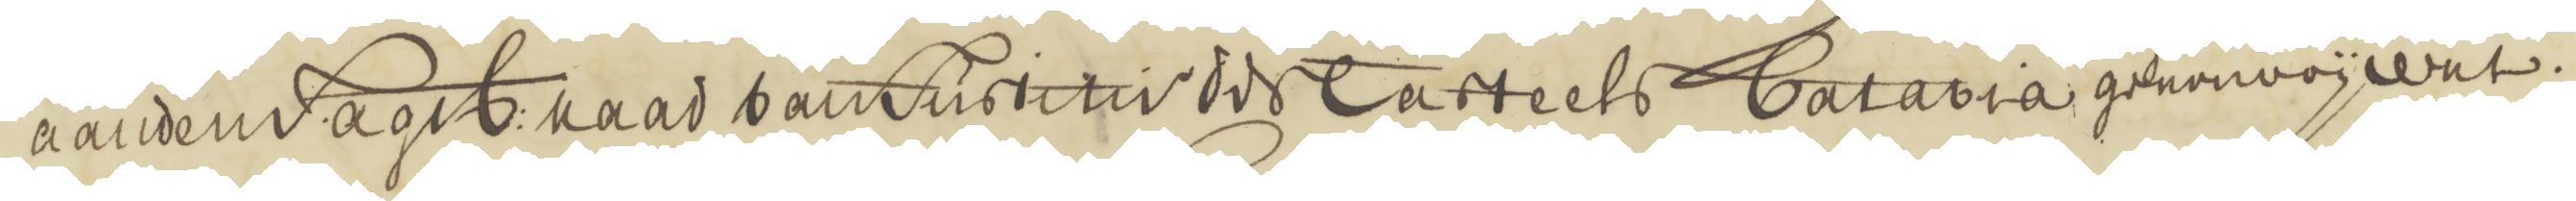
aan den E. agtb: raad van Justitie des Casteels batavia gerenvoijeert.
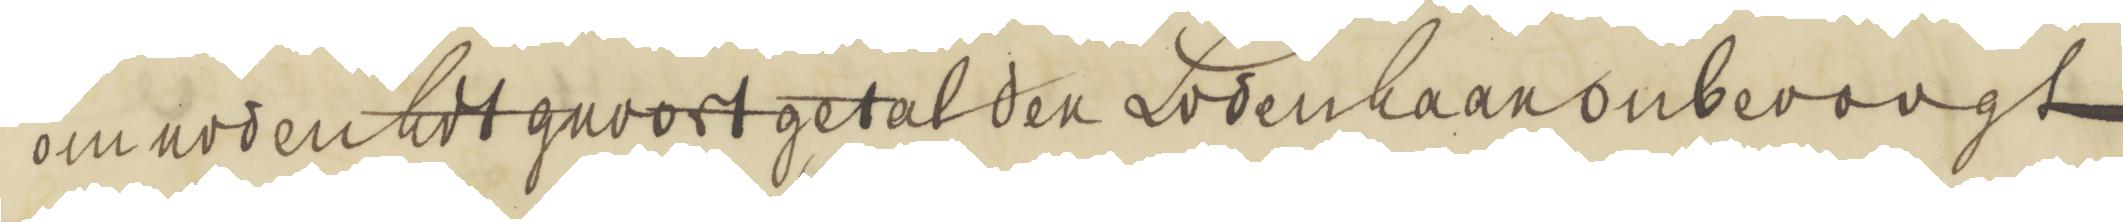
om reden het groost getal der Leden haar onbevoegt
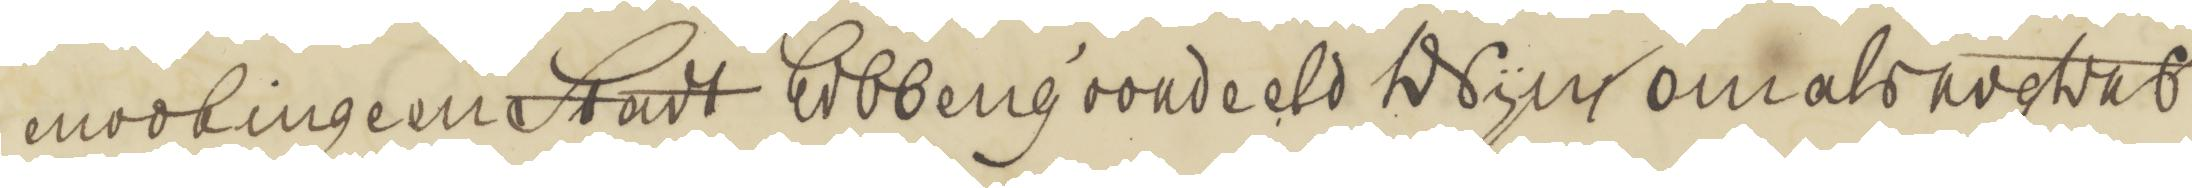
en ook in geen Staet hebben g'oordeeld te sijn, om als regters
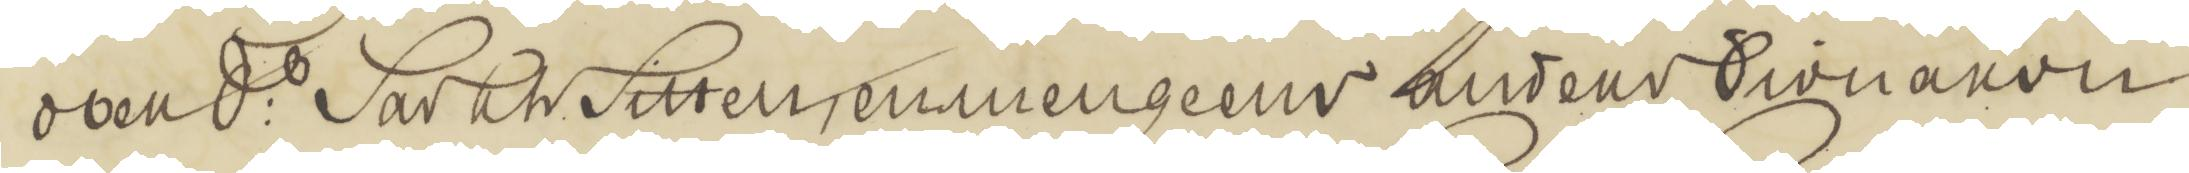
over d:o Saek te Sitten, en men geene andere dienaren
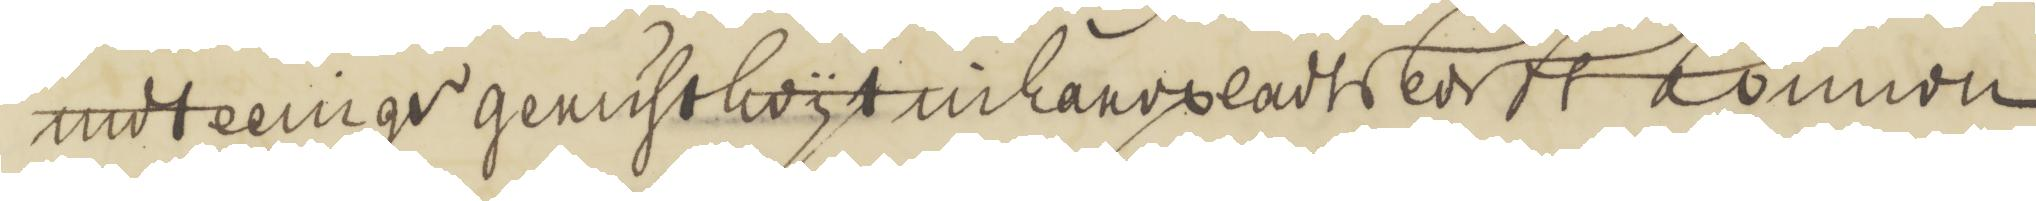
met eenige gerustheijt in hare plaets heeft konnen
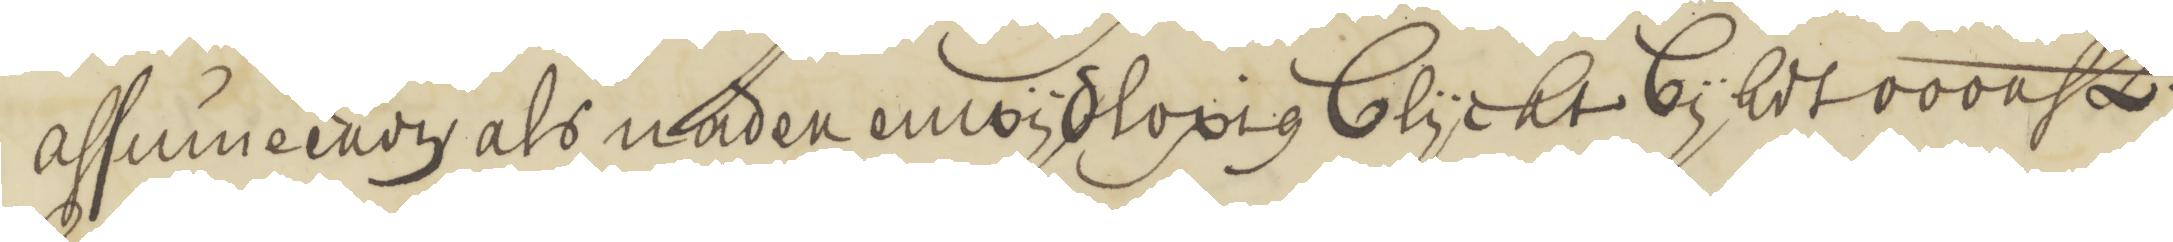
assumeeren als nader en wijdlopig blijckt bij het voorsz:
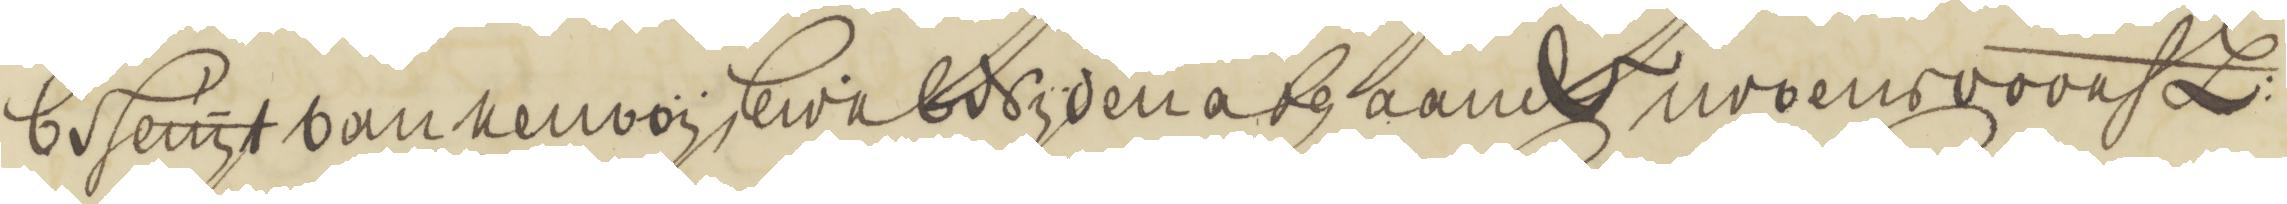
besluijt van renvoij, hier besijden afgaande nevens voorsz:
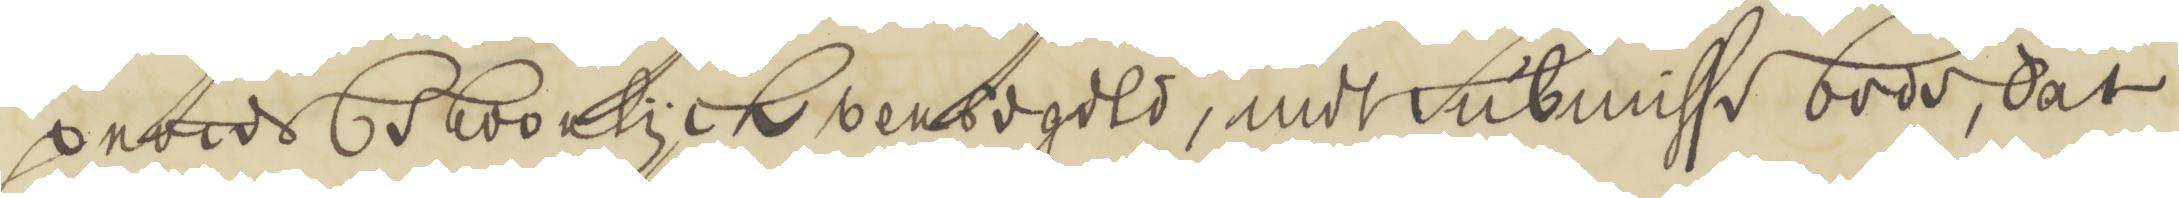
proces behoorlijck versegeld, met submisse bode, dat
